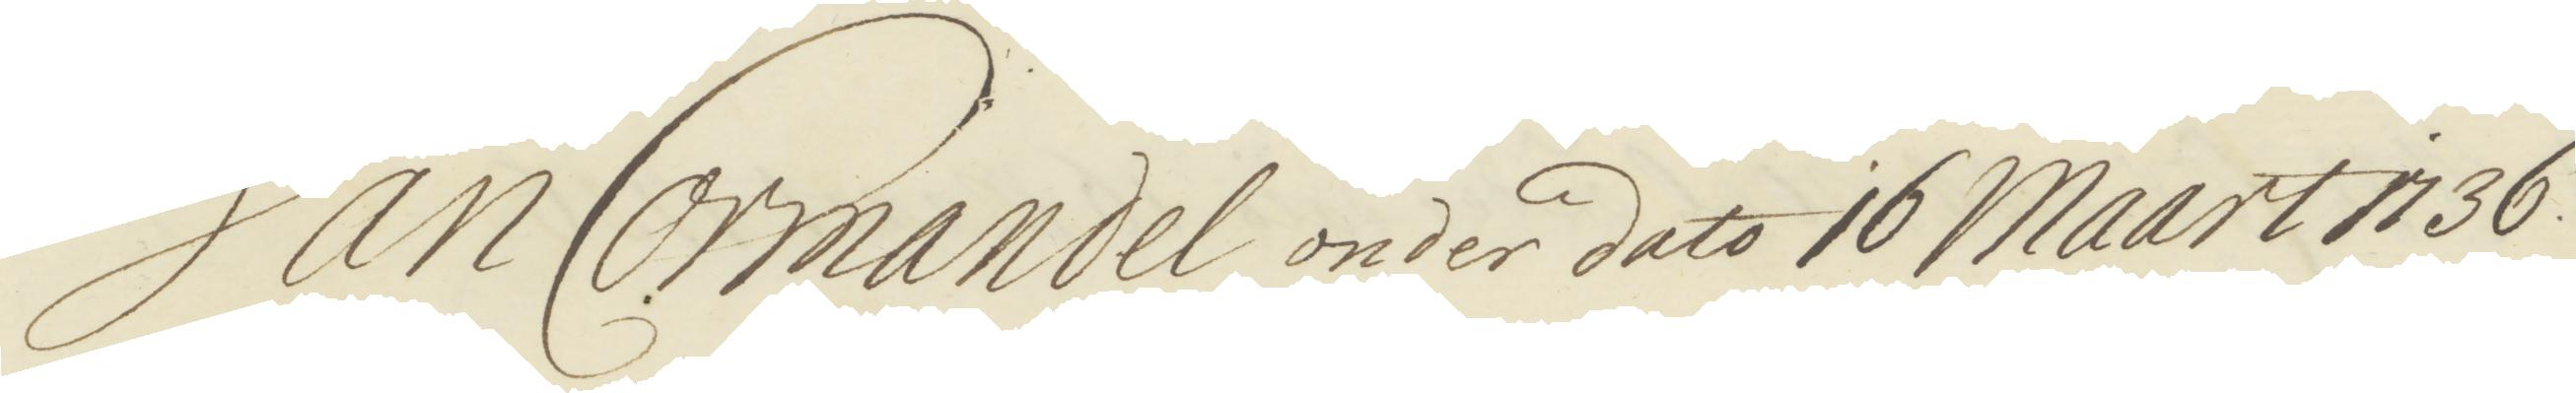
Van Cormandel onder dato 16 Maart 1736.
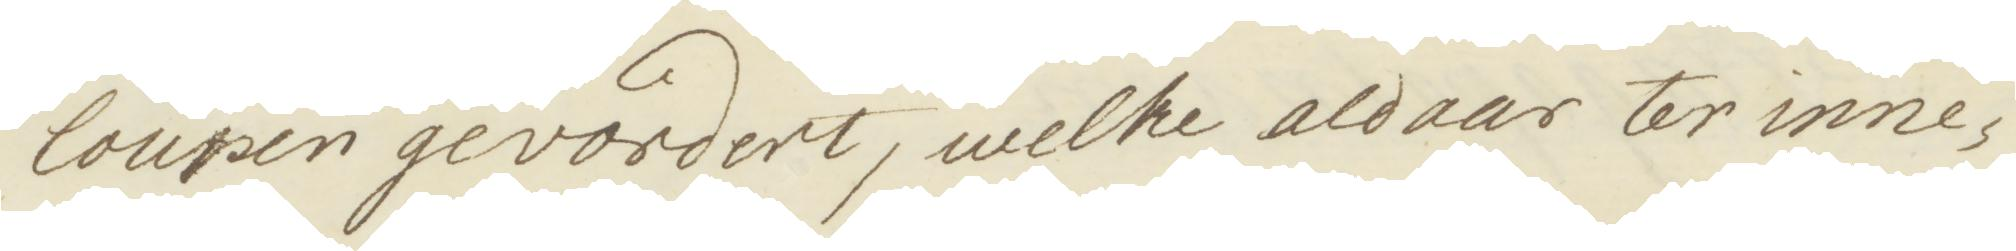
loupen gevordert, welke aldaar ter inne„
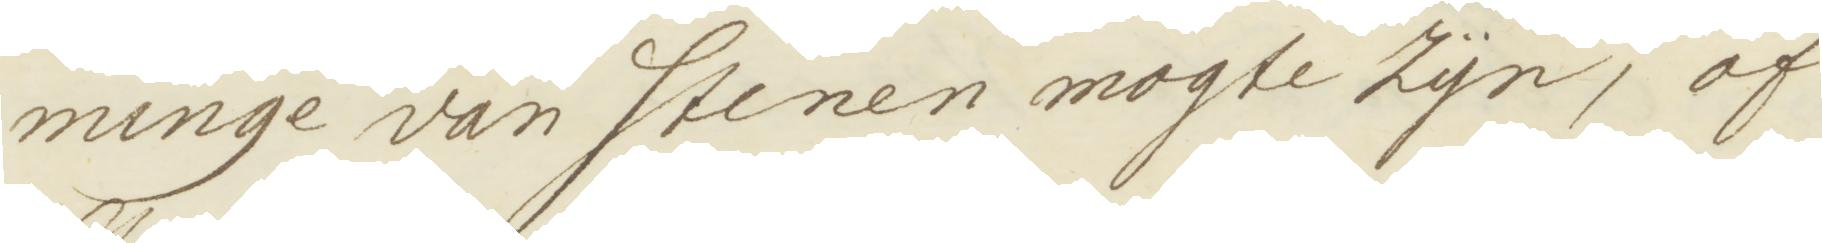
minge van stenen mogte zijn, of
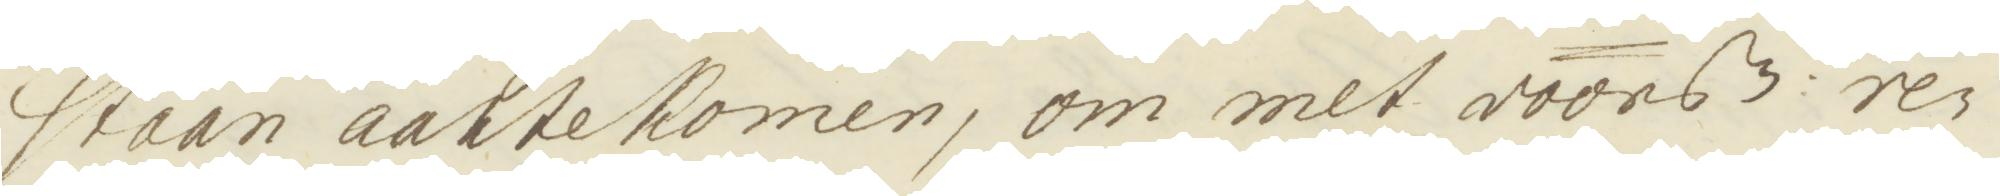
staan aantekomen, om met voorsz: re
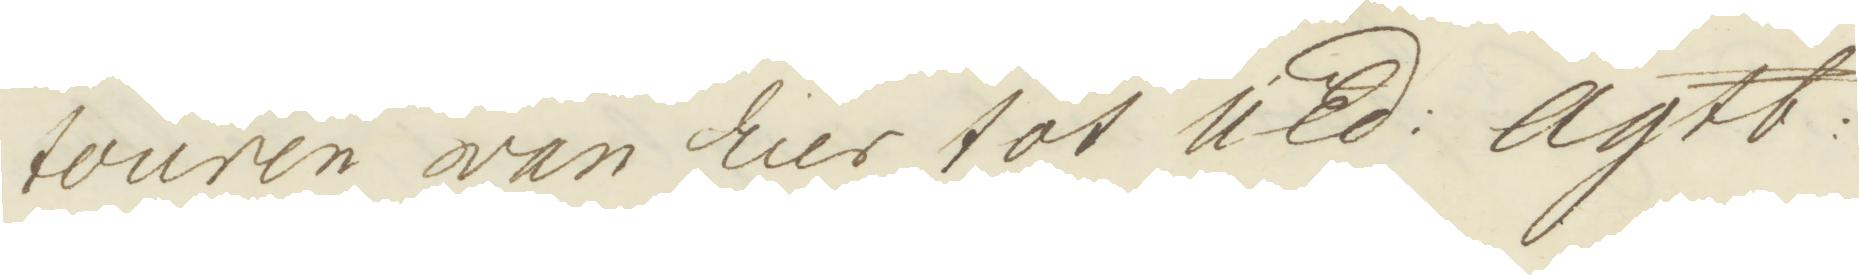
touren van hier tot uEd: Agtb:
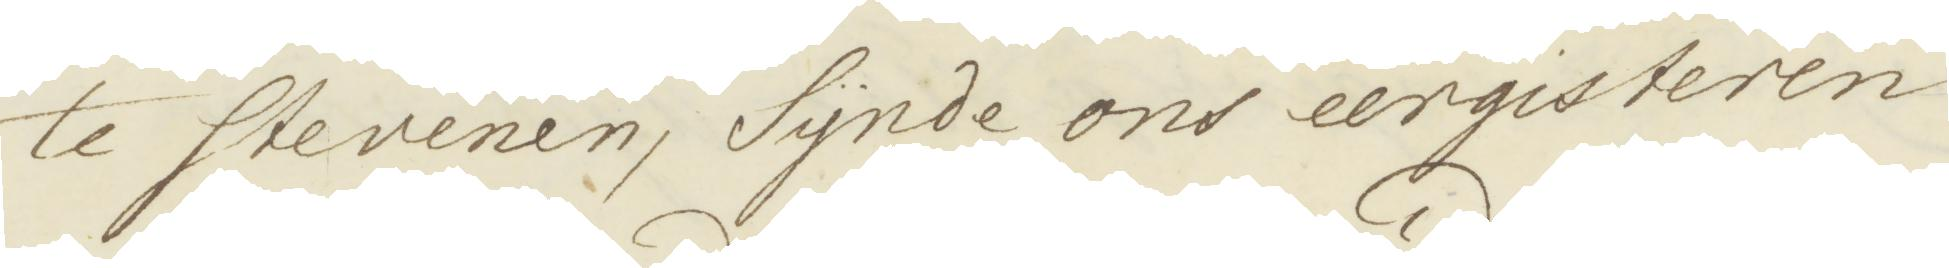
te stevenen, sijnde ons eergisteren
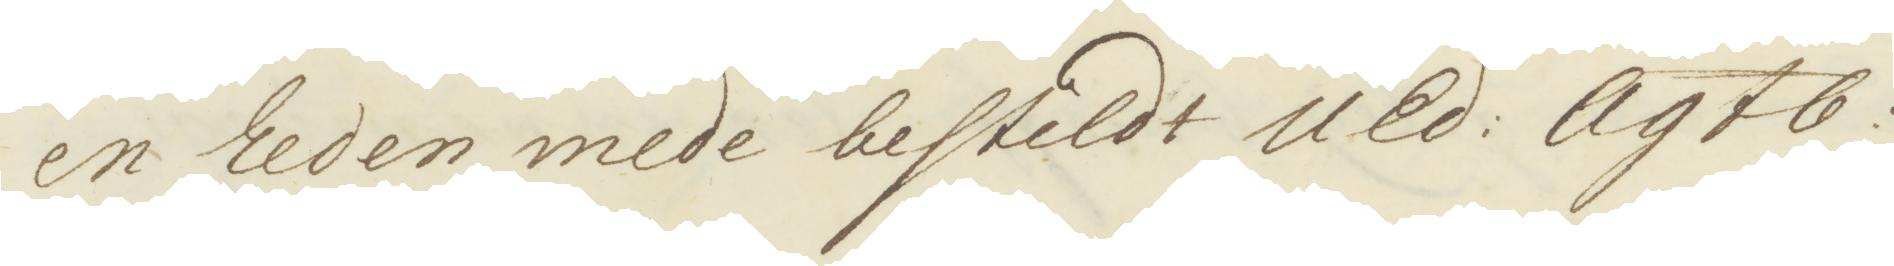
en heden mede besteldt uEd: Agtb:
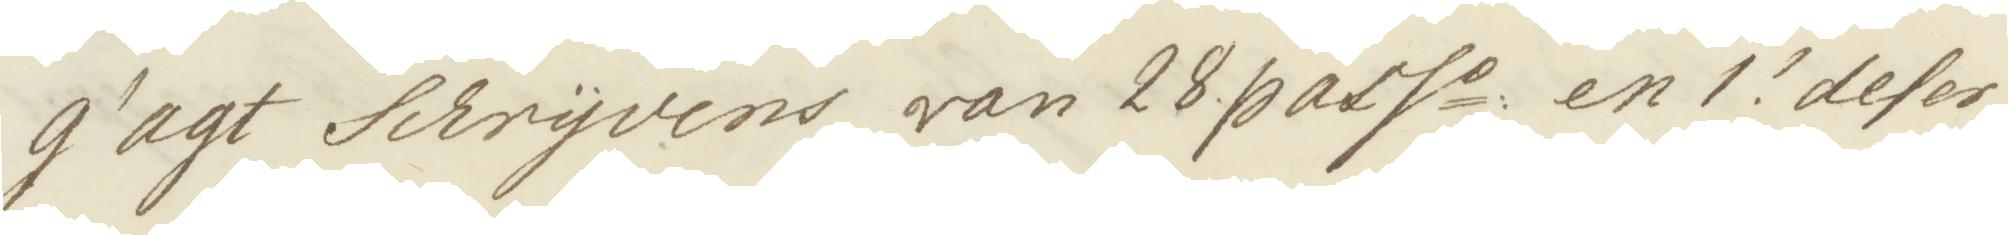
g’agt schrijvens van 28. pass=o: en 1.' deser,
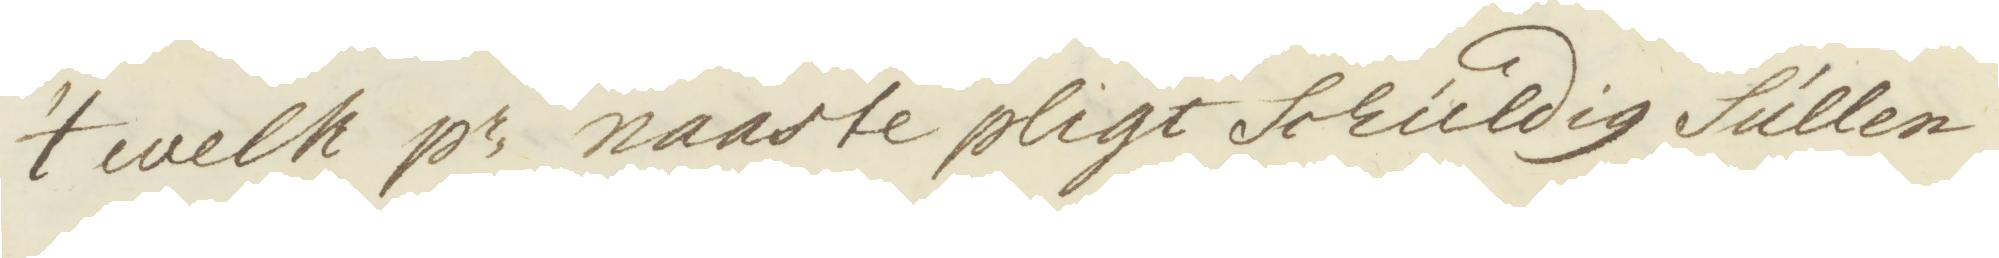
’t welk p„r naaste pligt schuldig sullen
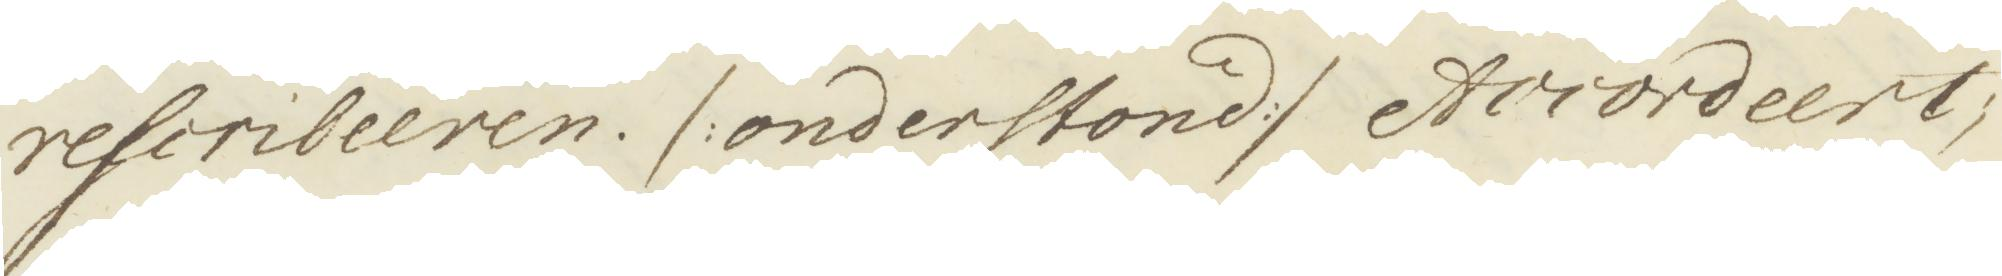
rescribeeren. /:onderstond:/ Accordeert;
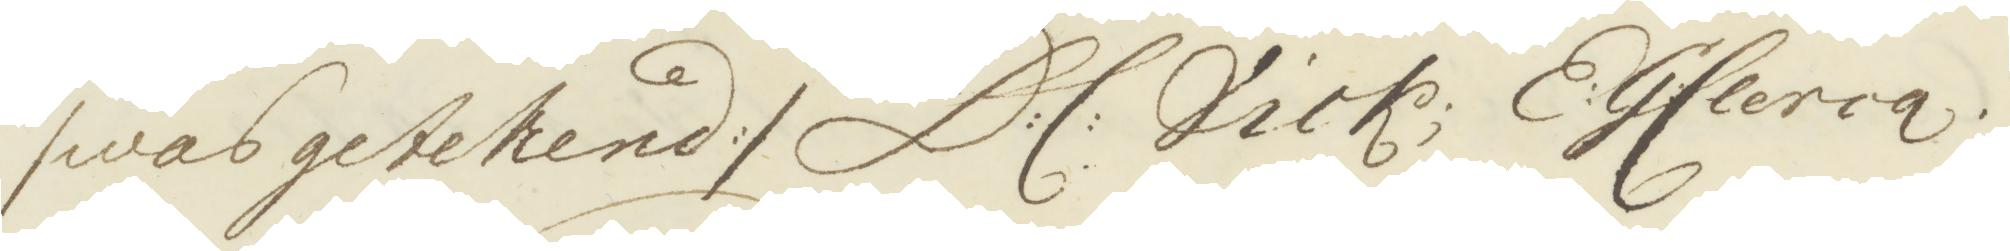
/was getekend:/ D: C: Vick; E: G: Clercq.
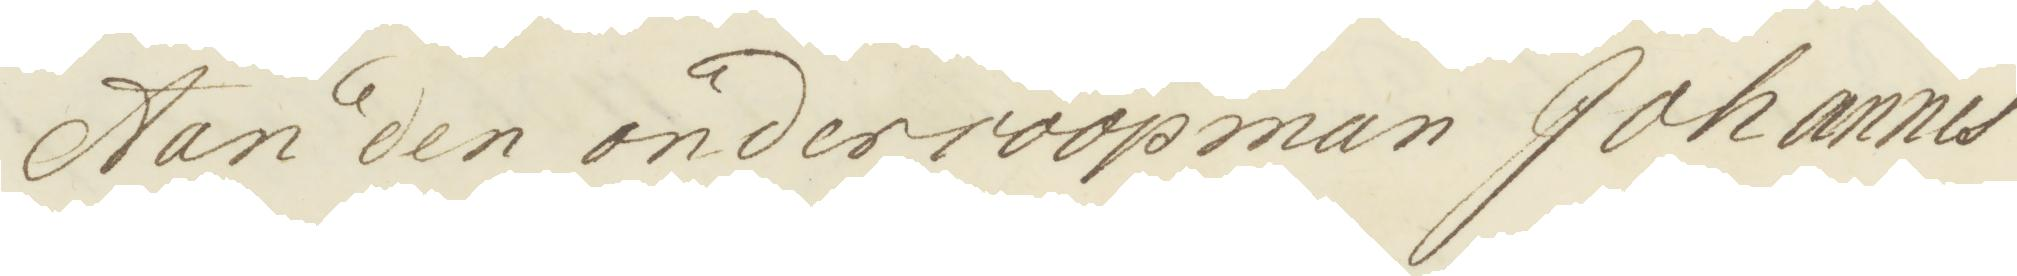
Aan den ondercoopman Johannes
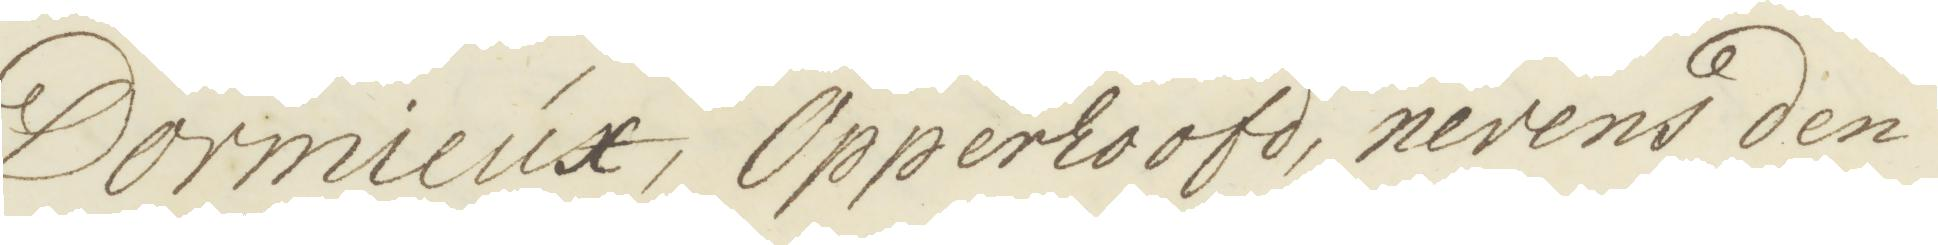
Dormieux, Opperhoofd, nevens den
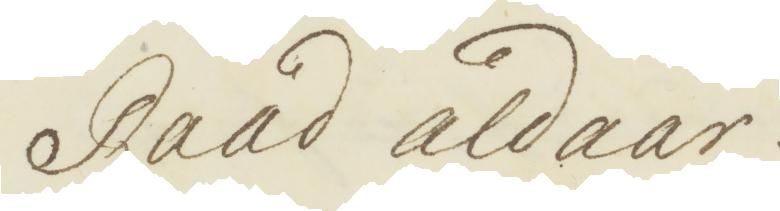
Raad aldaar
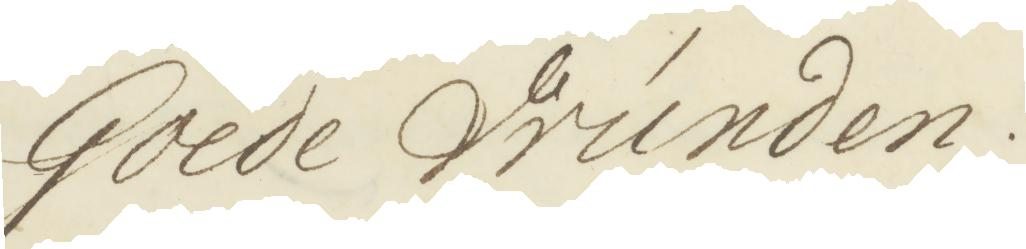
Goede Vrunden.
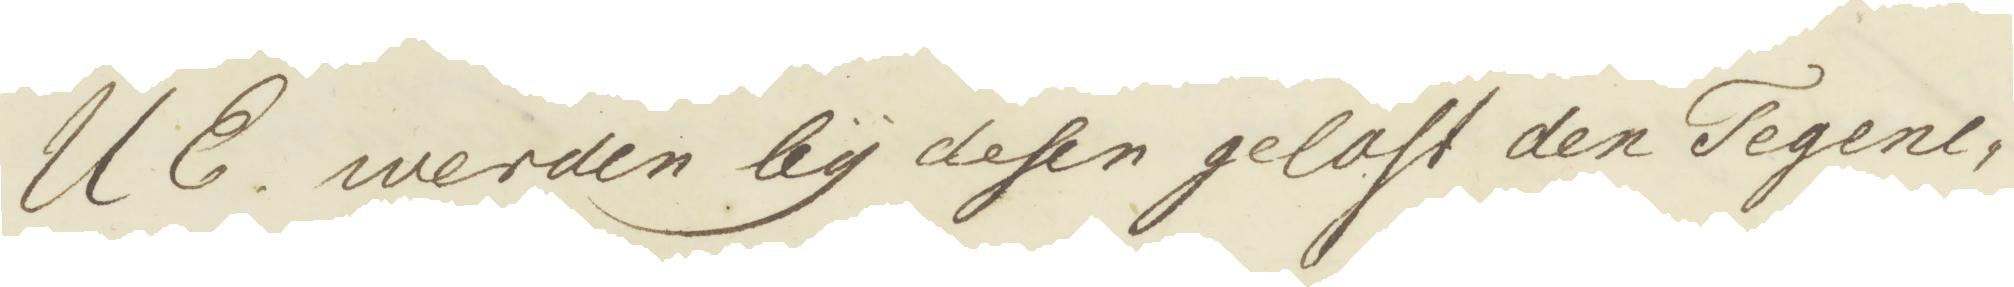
UE. werden bij desen gelast den Tegene„
